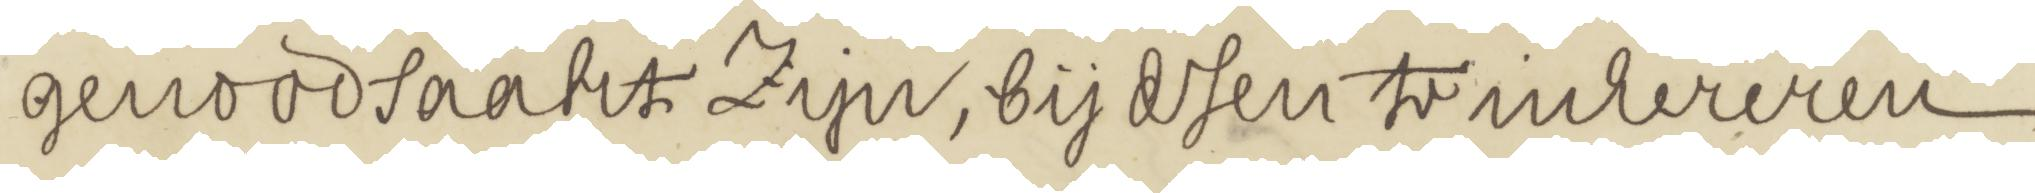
genoodsaakt Zijn, bij desen te inhereren
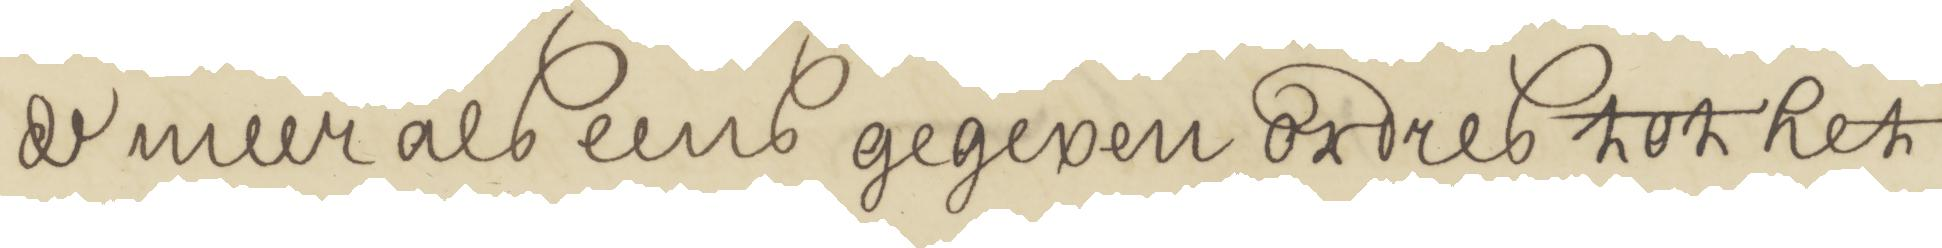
de meer als eens gegeven ordres tot het
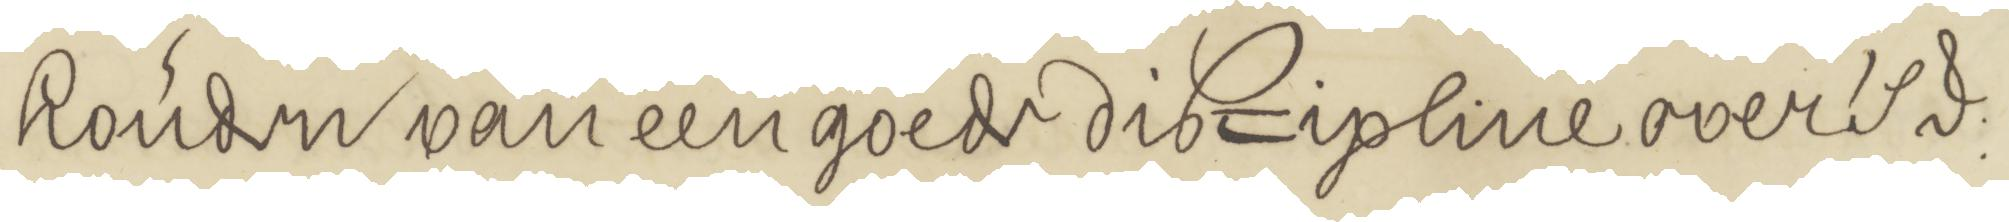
houden van een goede discipline over ’s E:
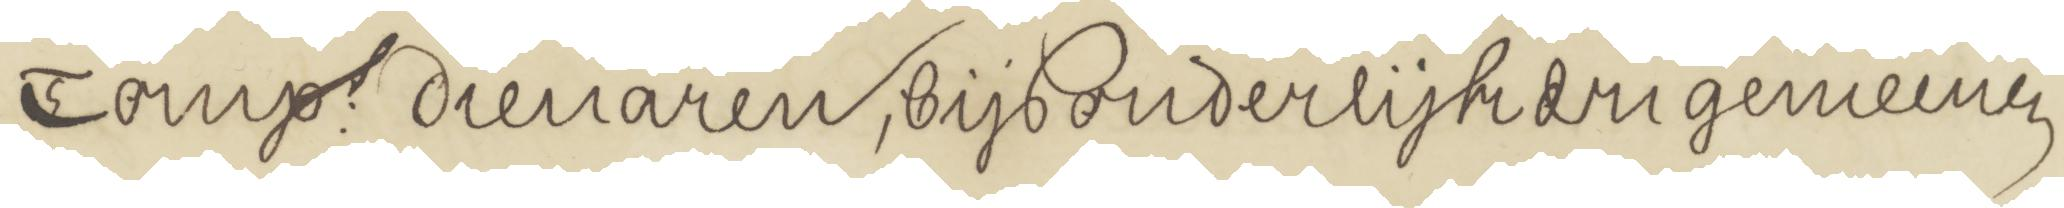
comp:s dienaren, bijsonderlijk den gemeenen
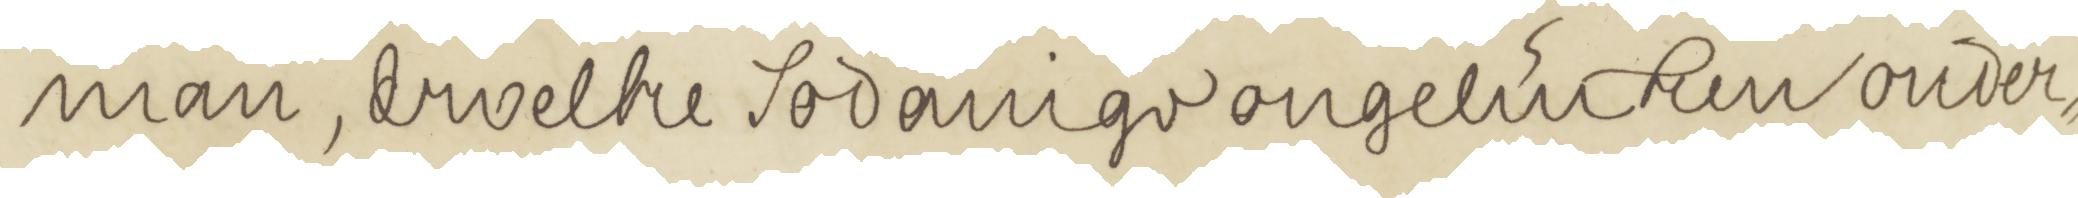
man, dewelke sodanige ongelucken onder
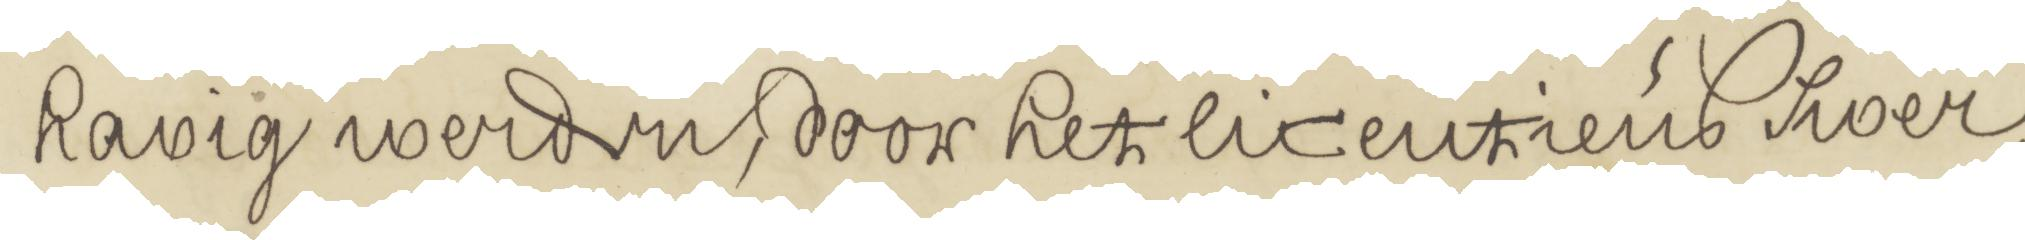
havig werden, door het licentieus swer
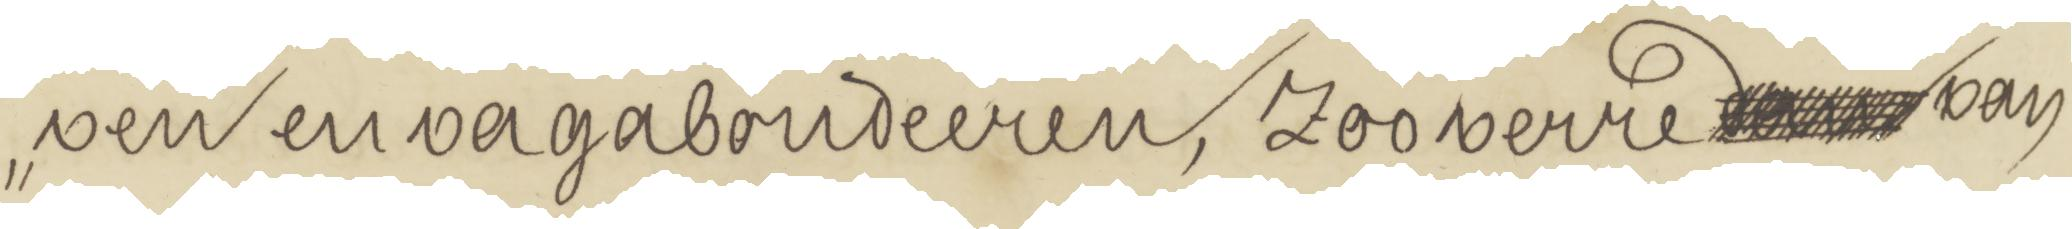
„ven en vagabondeeren, zoo verre van
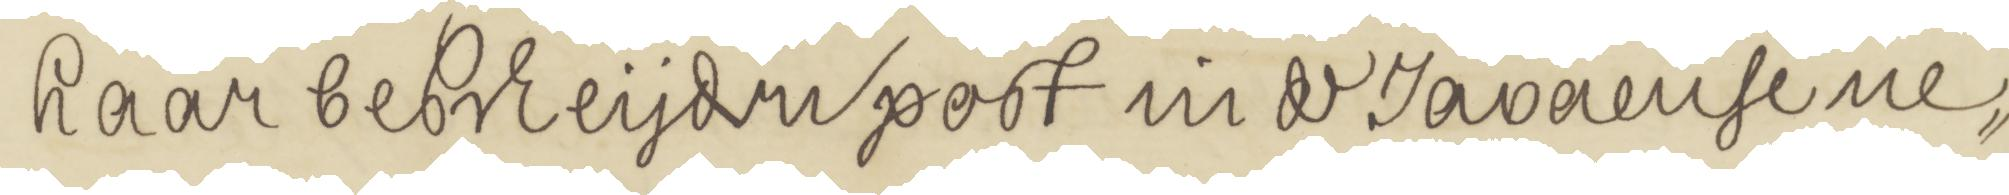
haar bescheijden post in de Javaense ne
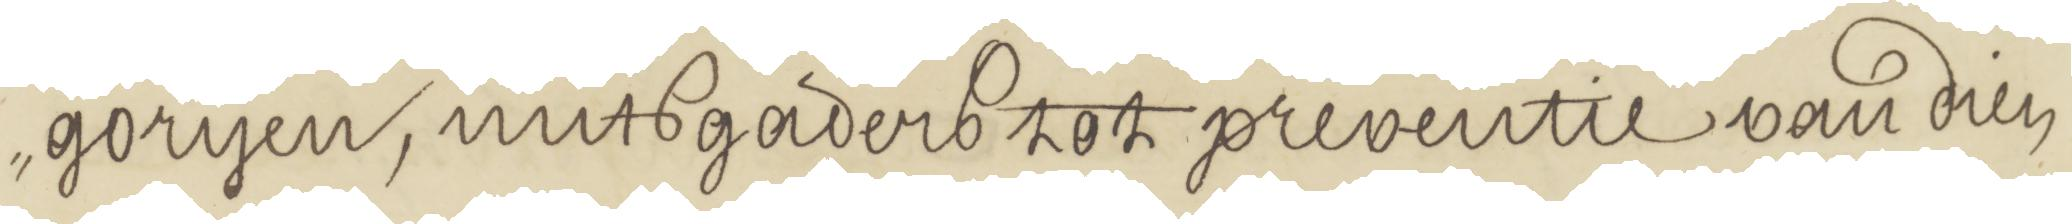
„gorijen, mitsgaders tot preventie van dien
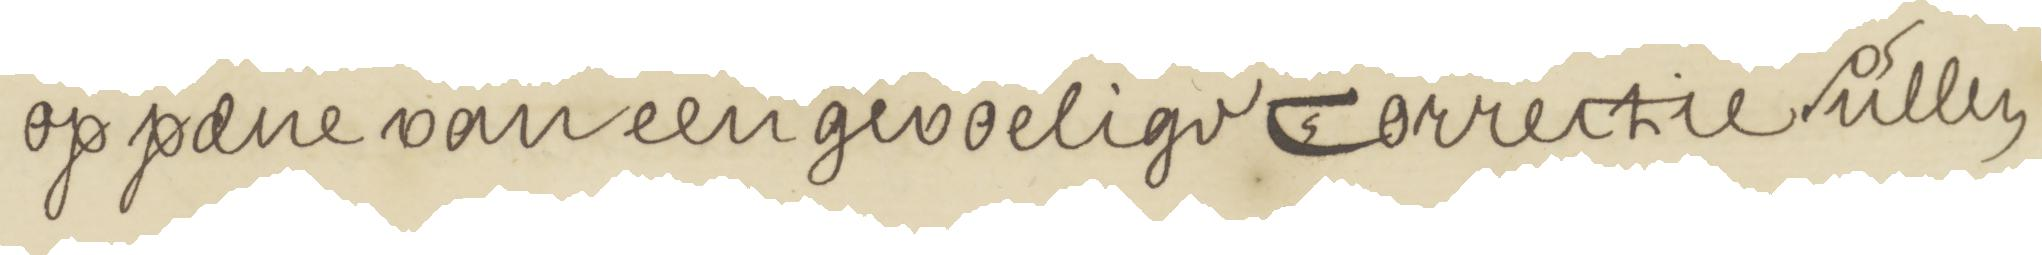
op poene van een gevoelige correctie sullen
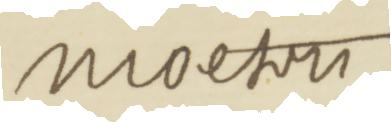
moeten.
